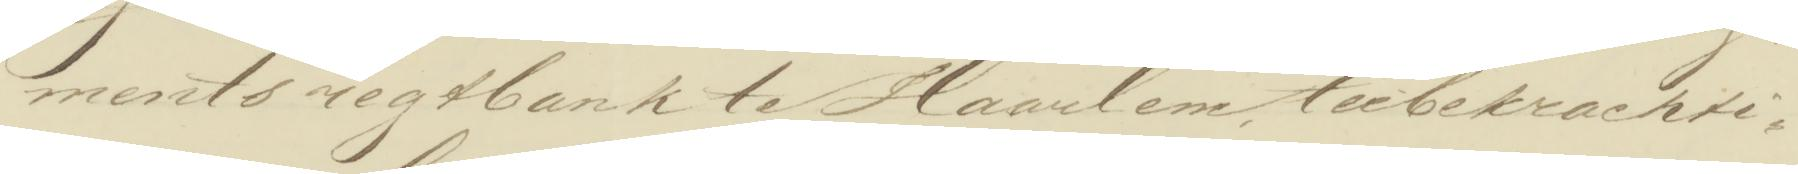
ments regtbank te Haarlem, terbekrachti„
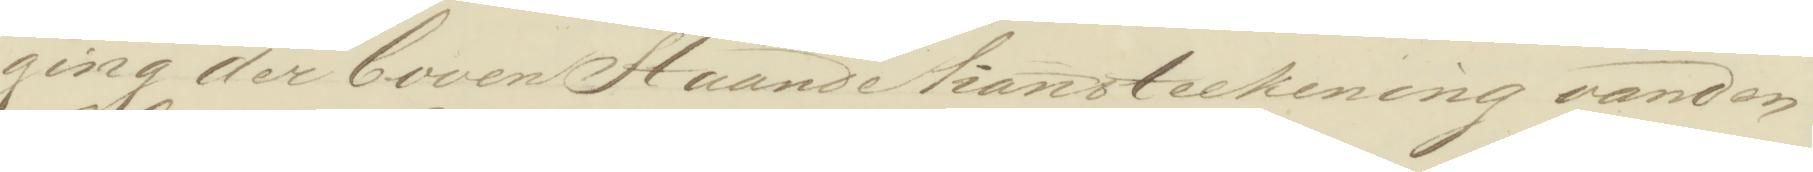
ging der boven staande handteekening vanden
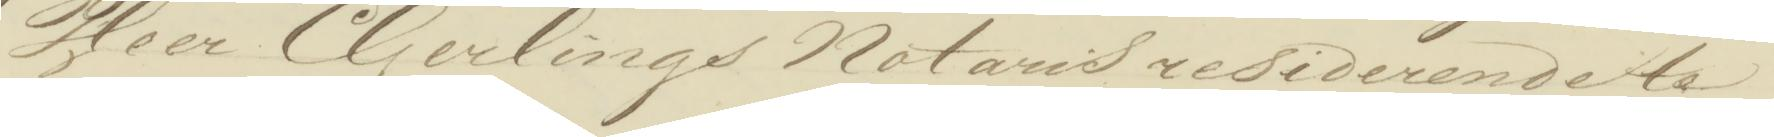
Heer CGerlings Notaris residerende te
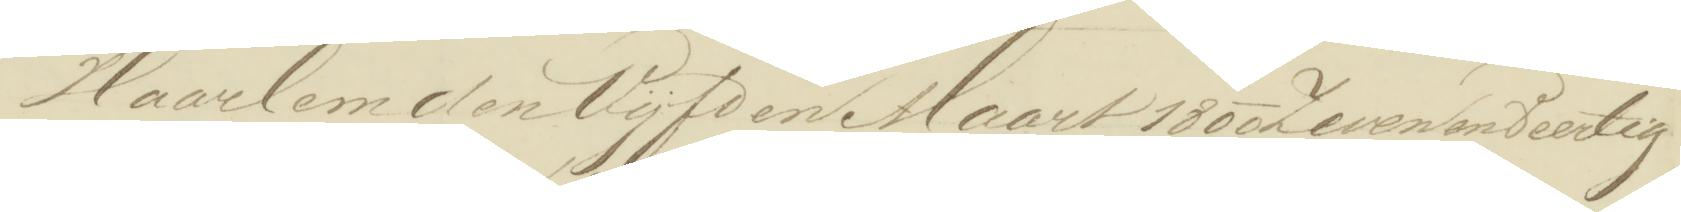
Haarlem den Vijfden Maart 1800 Zeven en Veertig
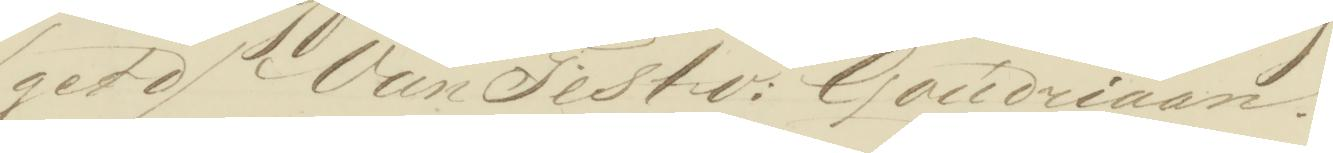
/getd/ Van Testv: Goudriaan.
